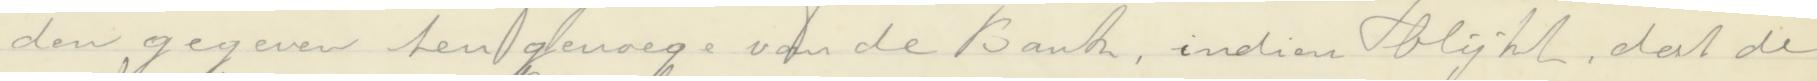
den gegeven ten genoege van de Bank, indien blijkt, dat de
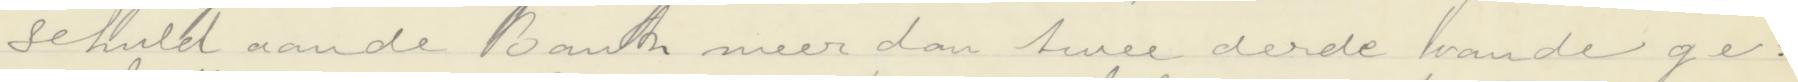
schuld aan de Bank meer dan twee derde vande ge:
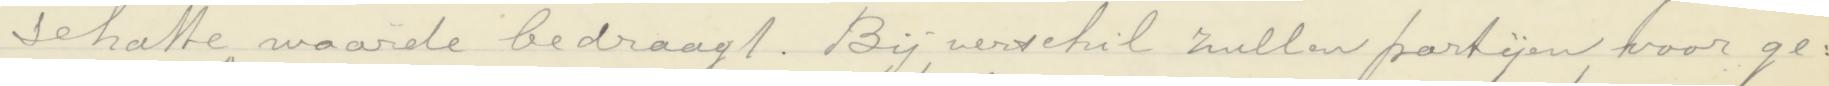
schatte waarde bedraagt. Bij verschil zullen partijen voor ge
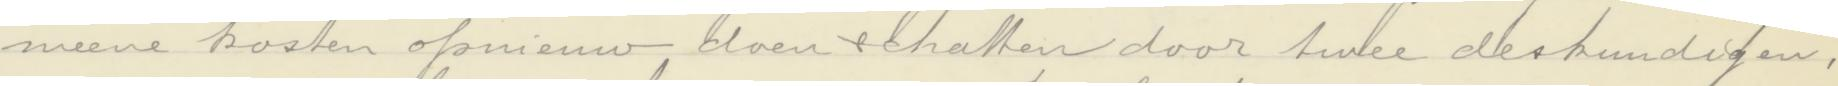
meene kosten opnieuw doen schatten door twee deskundigen
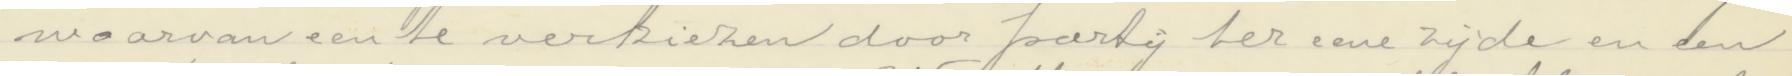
waarvan een te verkiezen door partij ter eene zijde en een
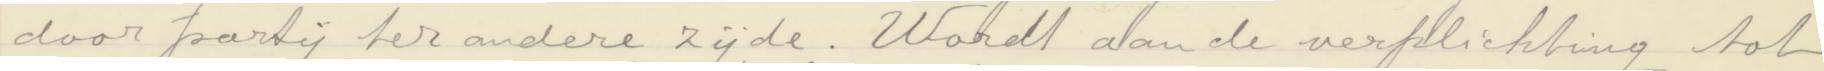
door partij ter andere zijde. Wordt aan de verplichting tot
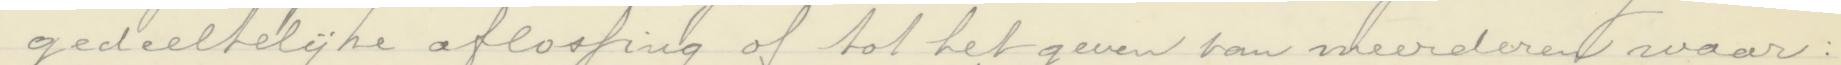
gedeeltelijke aflossing of tot het geven van meerderen waar
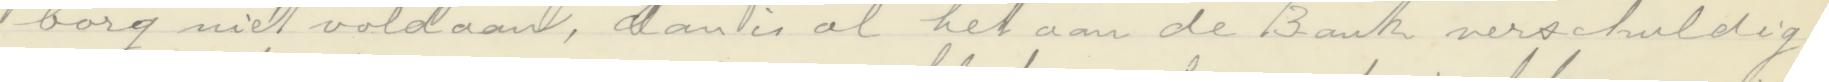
borg niet voldaan, dan is al het aan de Bank verschuldig
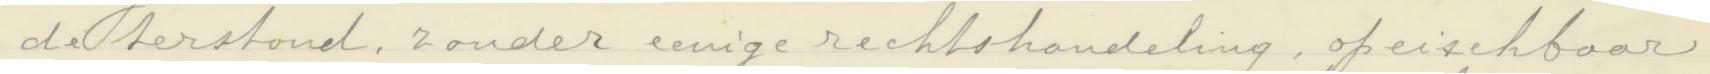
de terstond, zonder eenige rechtshandeling, op eischbaar
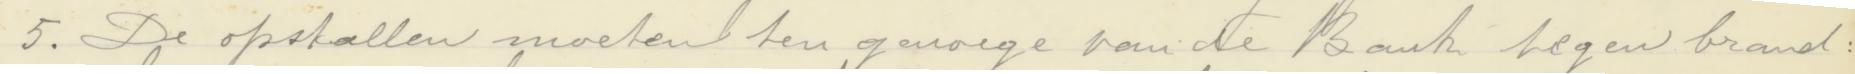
5. De opstallen moeten ten genoege van de Bank tegen brand
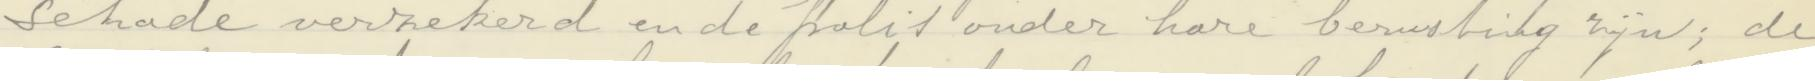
schade verzekerd en de polis onder hare berusting zijn; de
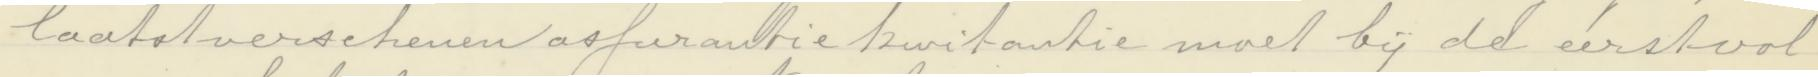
laatst verschenen assurantie kwitantie moet bij de eerstvol
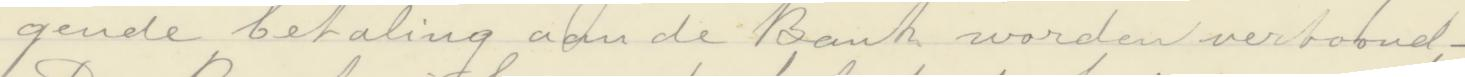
gende betaling aan de Bank worden vertoond
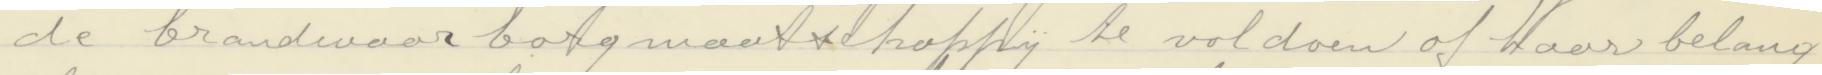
de brandwaarborg maatschappij te voldoen of haar belang
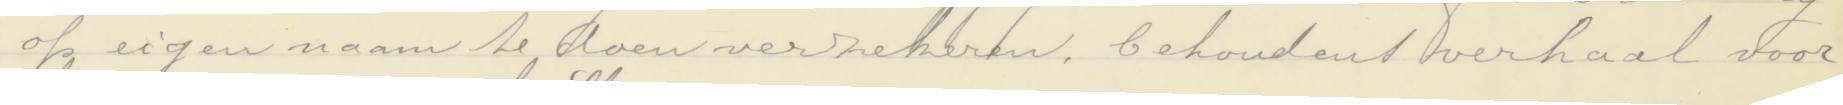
op eigen naam te doen verzekeren, behoudens verhaal voor
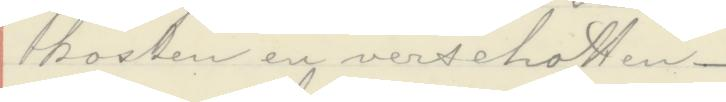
kosten en verschotten
